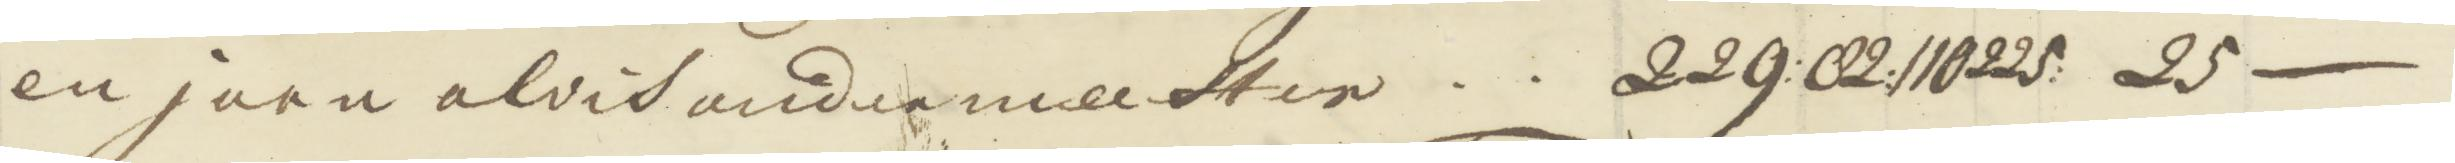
en joan alvis ondermeester . . 229: 82:110 225: 25 —
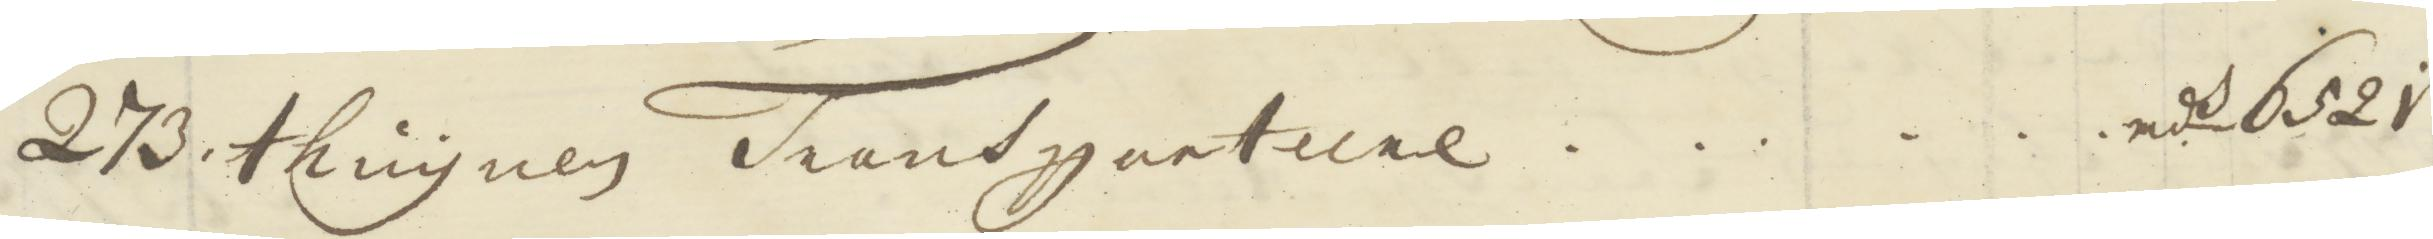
273: thuijnen Transporteere . . . . . . rd=s 6521
